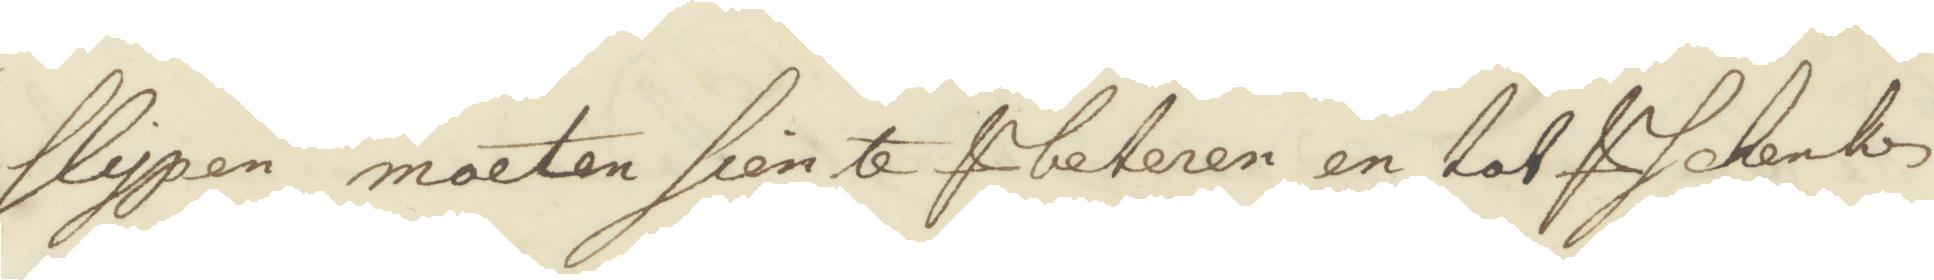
slijpen moeten sien te verbeteren en tot verschenken
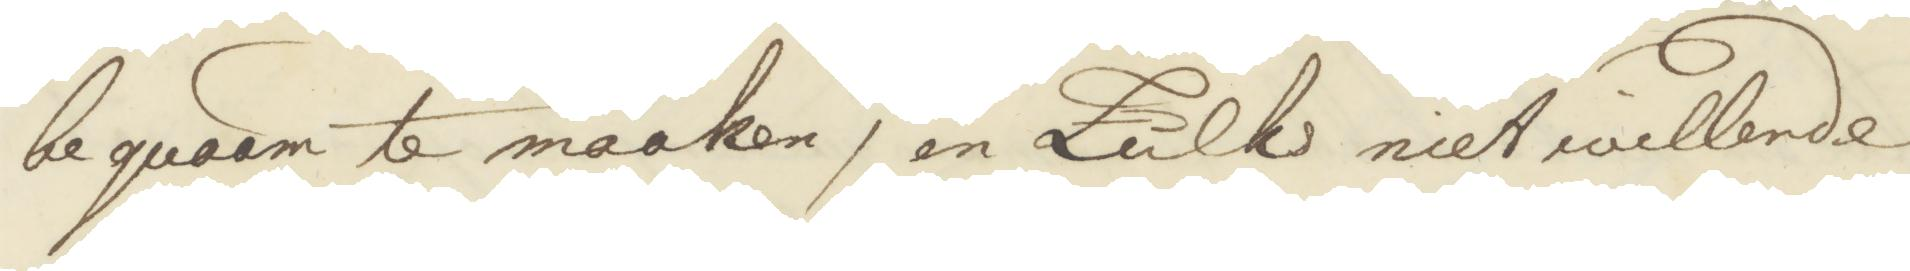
bequaam te maaken, en zulks niet willende
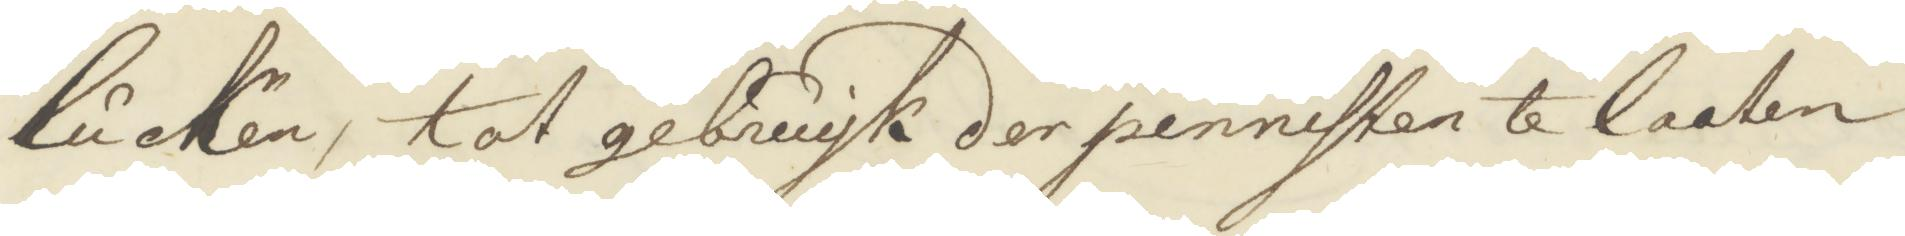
lucken, tot gebruijk der pennisten te laaten
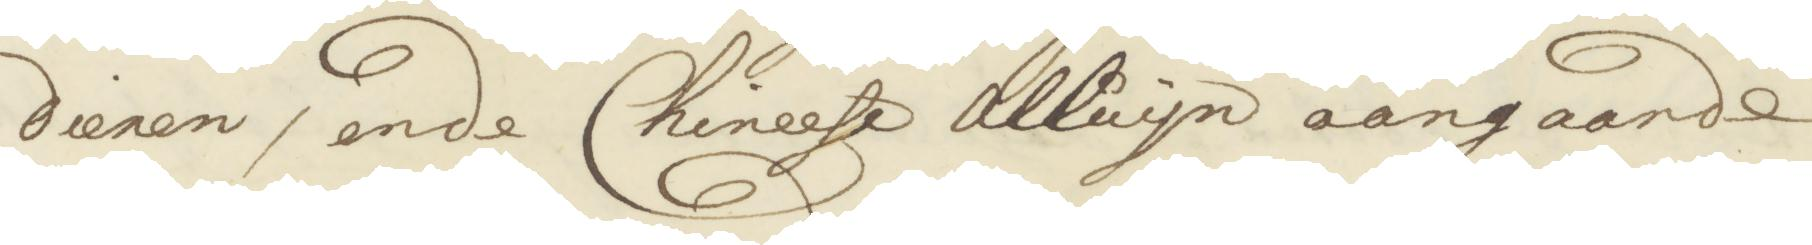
dienen, ende Chineese alluijn aangaande
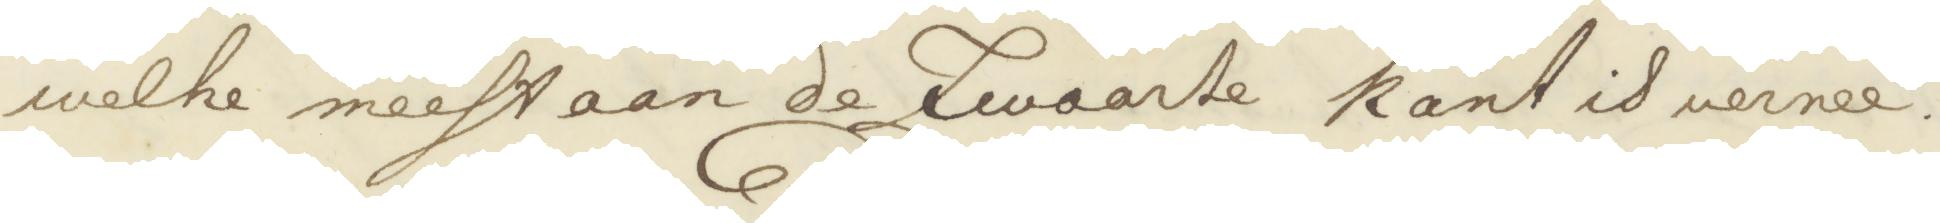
welke meest aan de zwaarte kant is vernee„
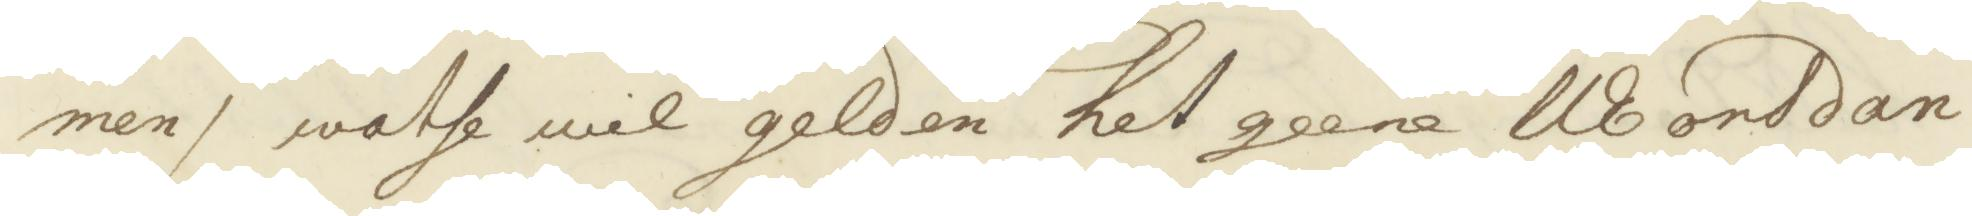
men, watse wil gelden het geene UE ons dan
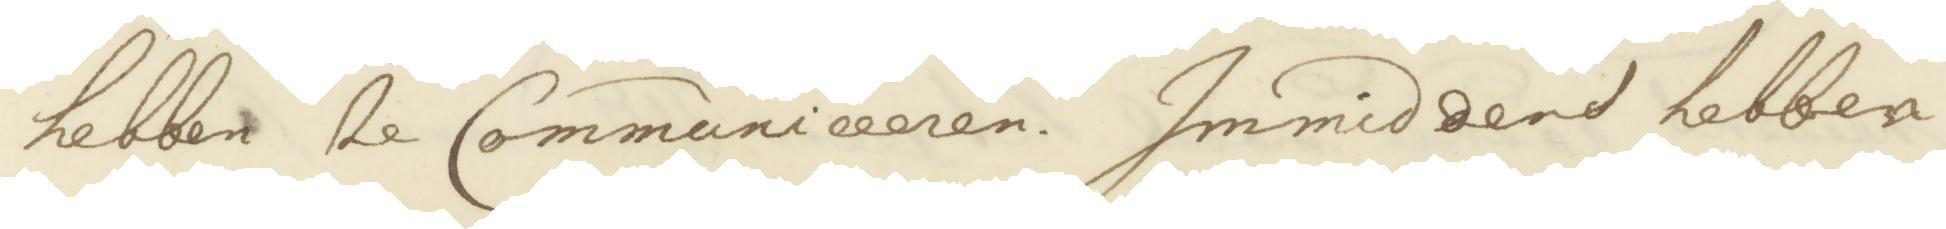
hebben te Communiceeren. Immidders hebben
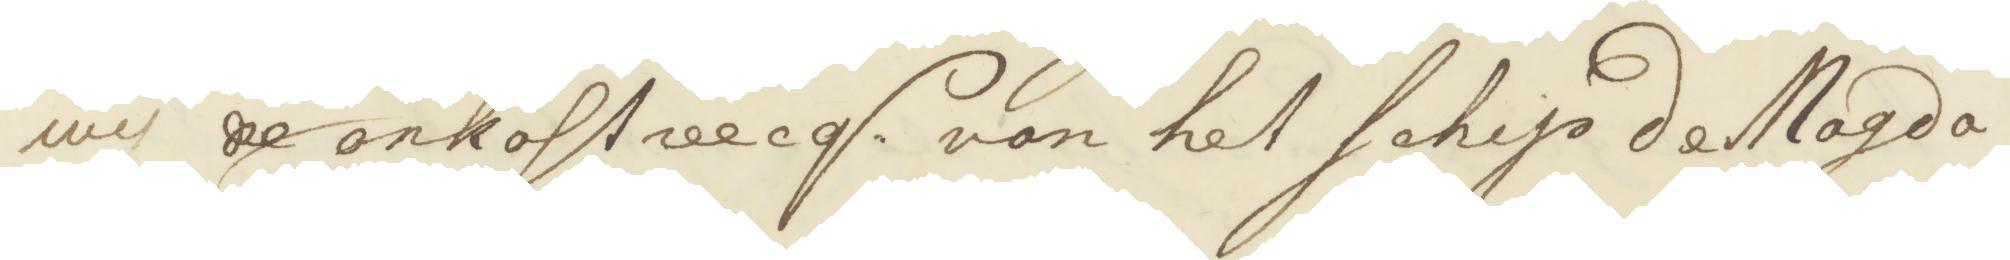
wij de onkost reecq: van het schip de Magda
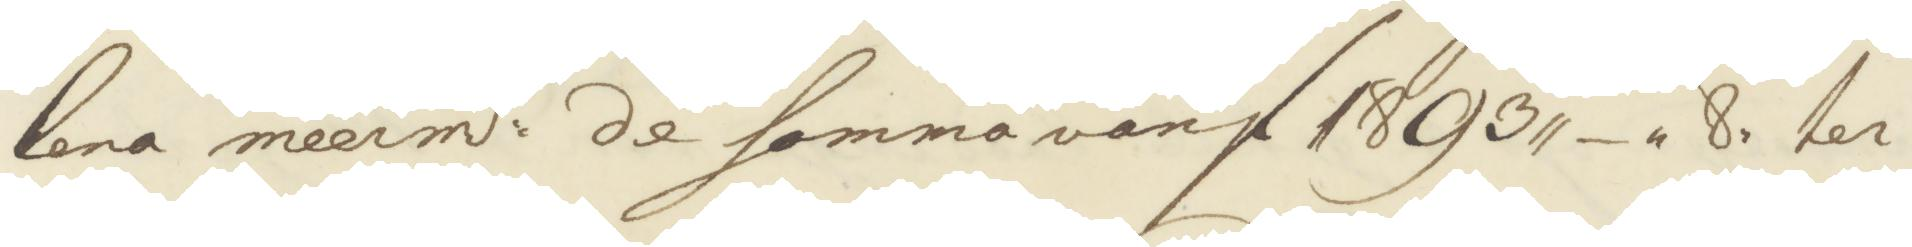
lena meerm: de somma van ƒ 1893„ —„ 8„ ter
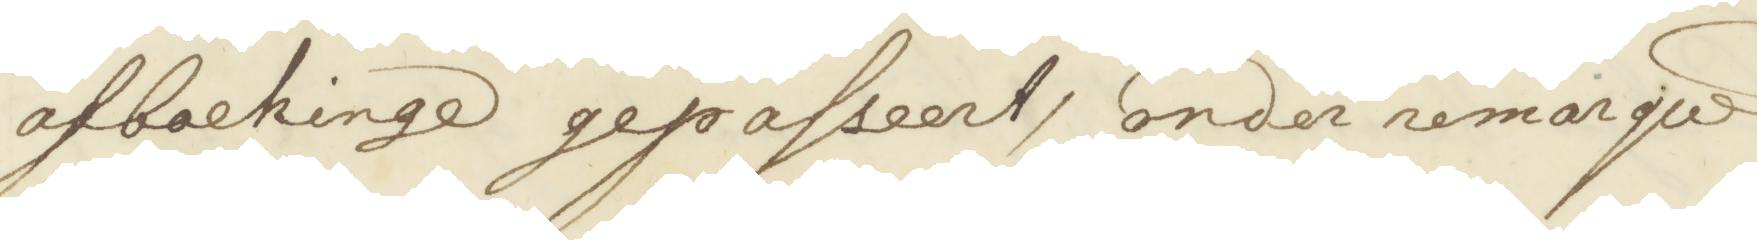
afboekinge gepasseert, onder remargie
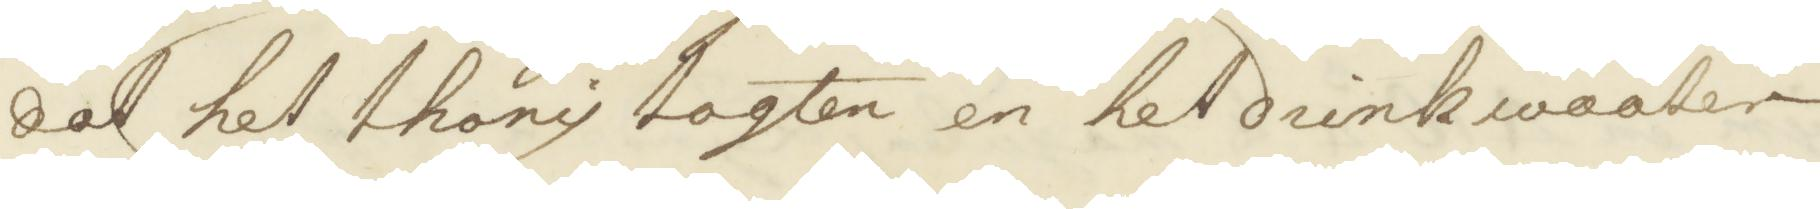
dat het thonij togten en het drinkwaater
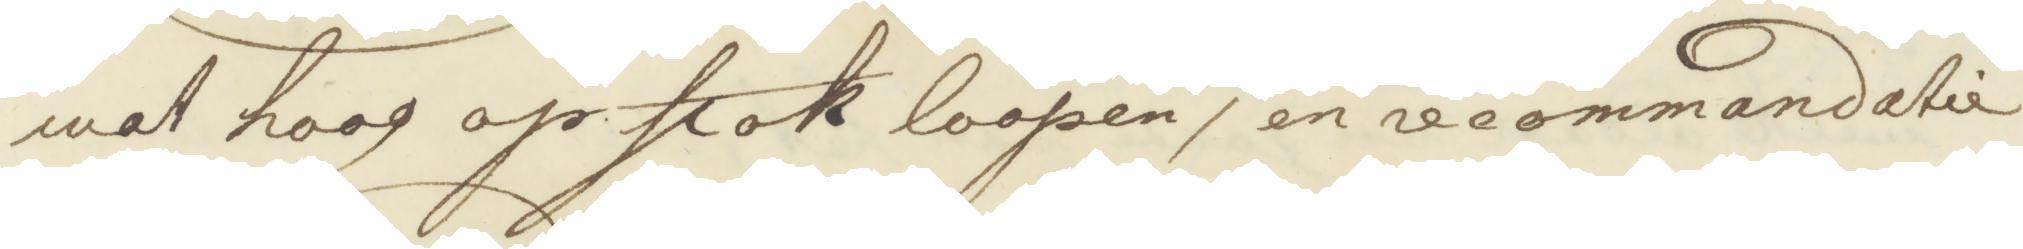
wat hoog op stok loopen, en recommandatie
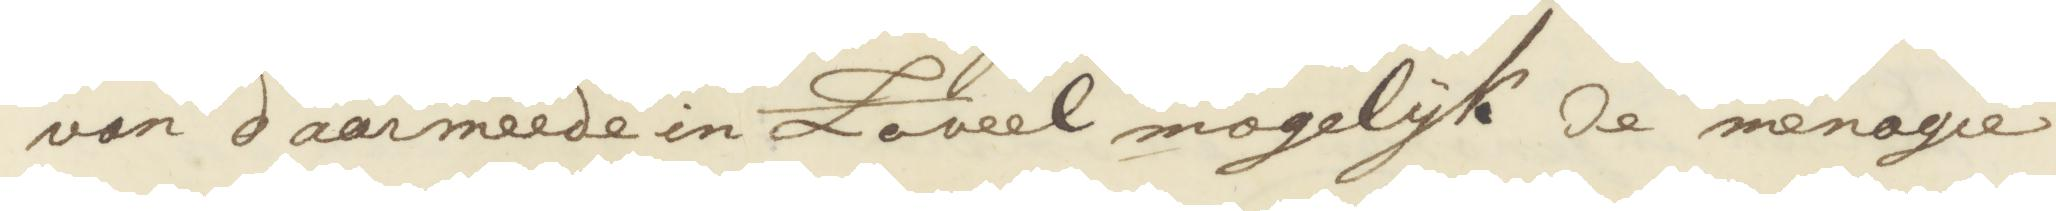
van daarmeede in zoveel mogelijk de menagie
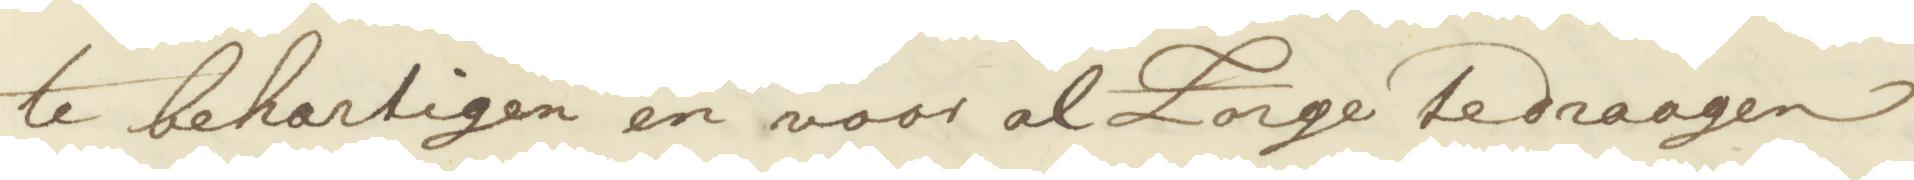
te behartigen en voor al zorge te draagen
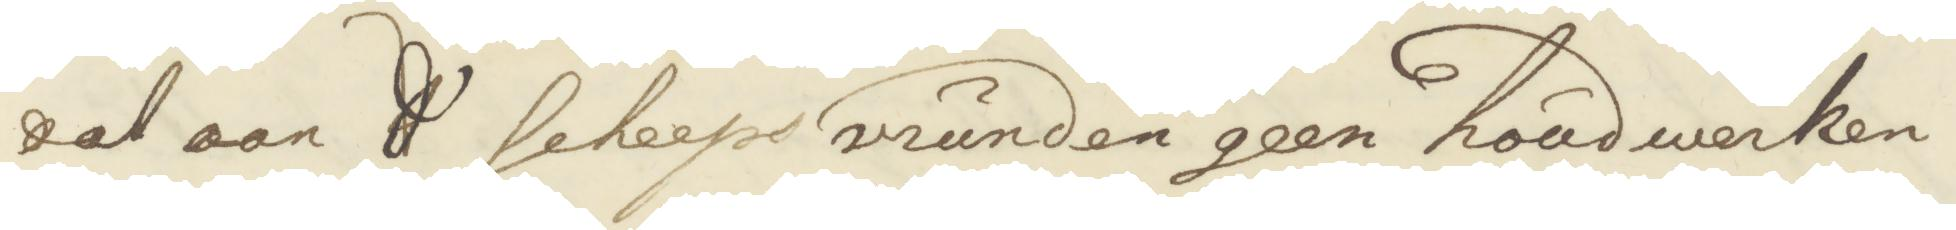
dat aan d’ scheeps vrunden geen houdwerken
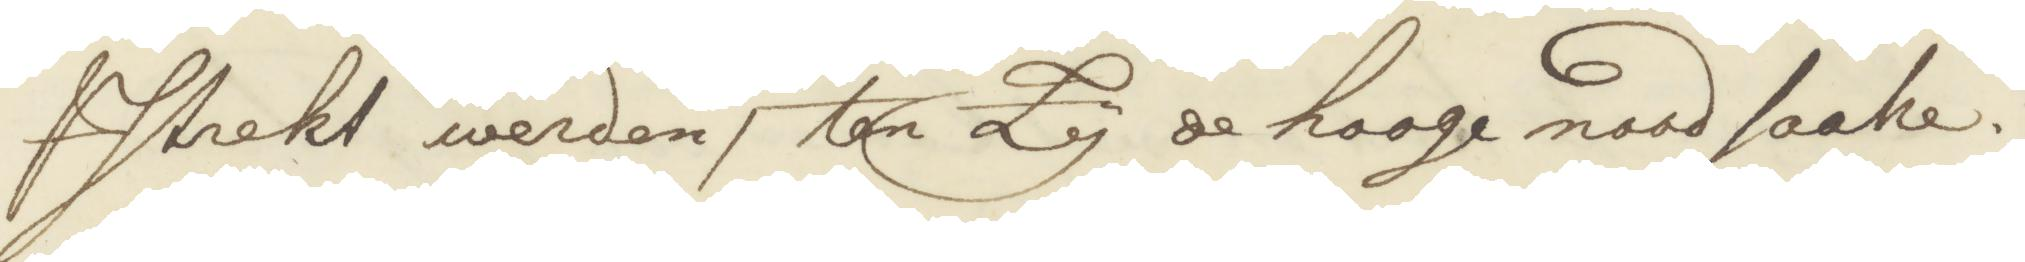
verstrekt werden, ten zij de hooge nood saake.
